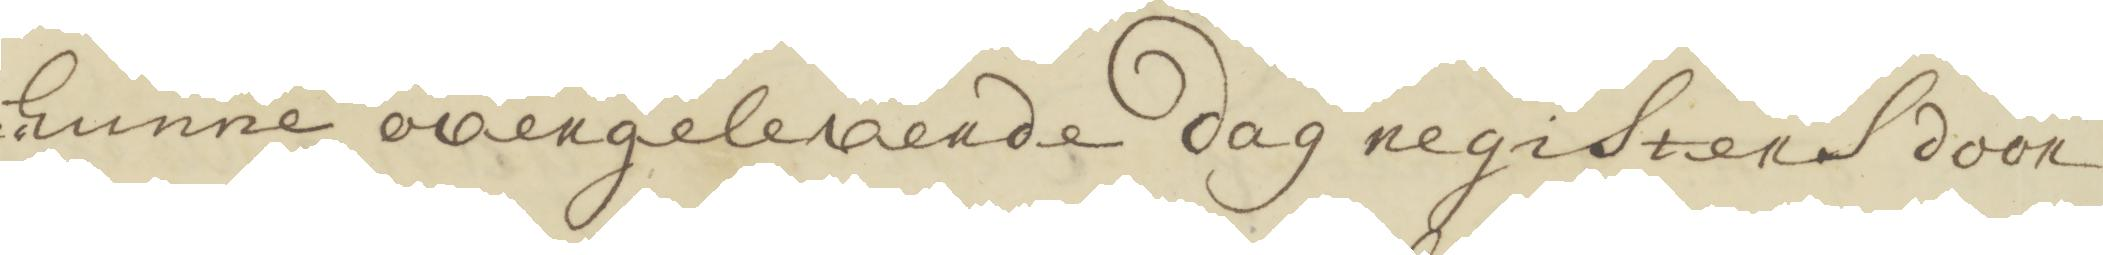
hunne overgeleverde dag registers door
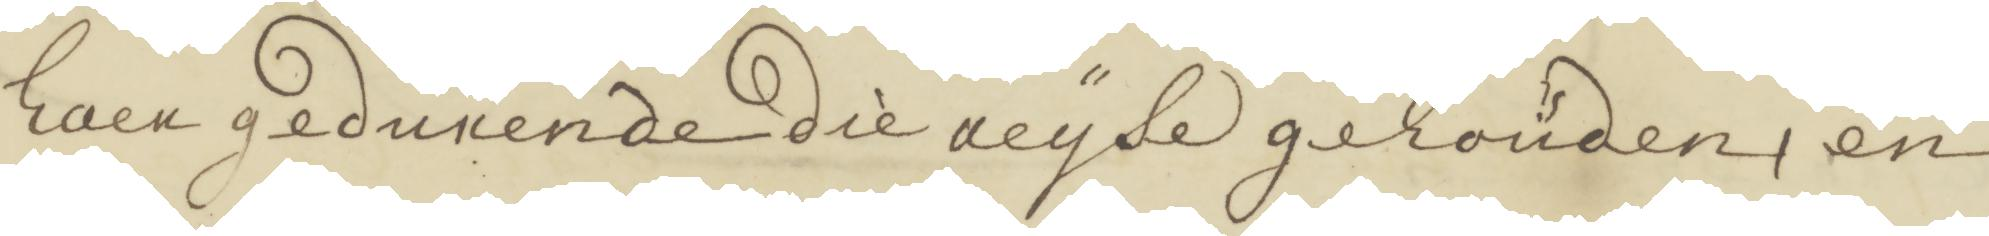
haer gedurende die reijse gehouden, en
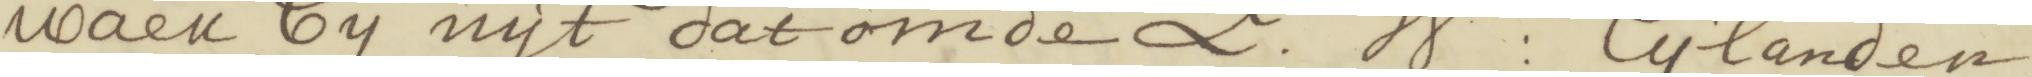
waer bij uijt dat om de Z.t W:r Eijlanden
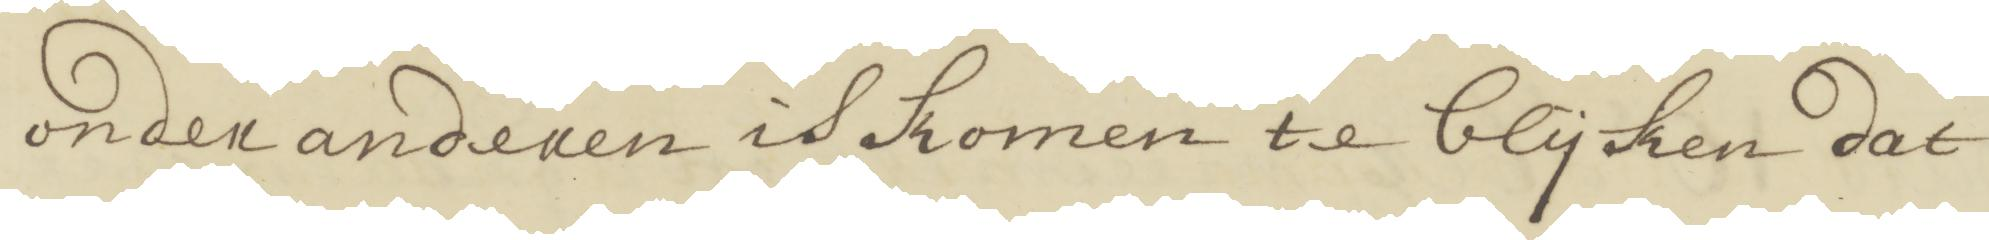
onder anderen is komen te blijken dat
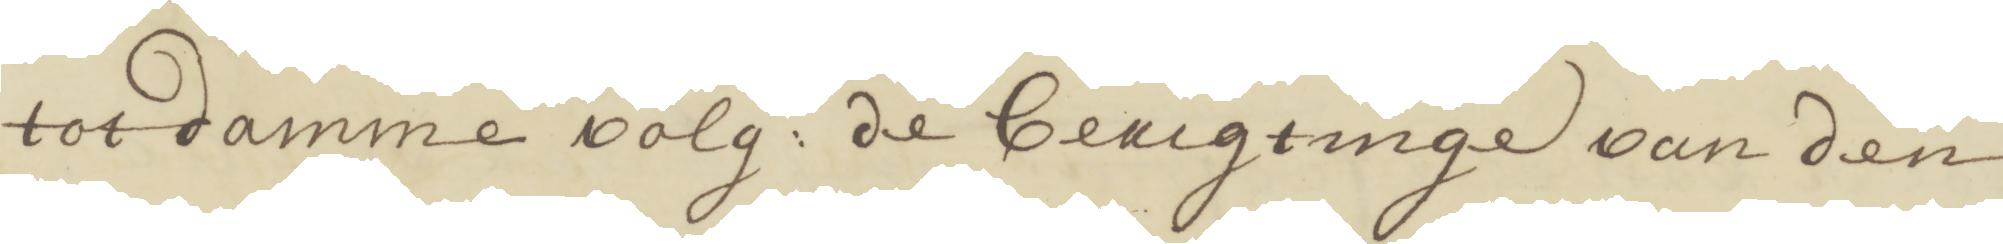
tot damme volg:s de berigtinge van den
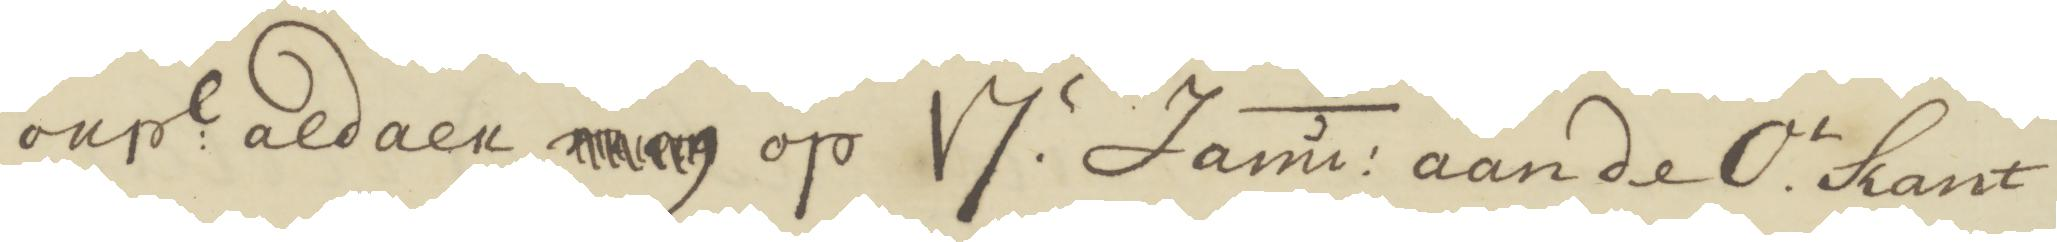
Corp:l aldaer nog op 17.' Janu: aan de O.t kant
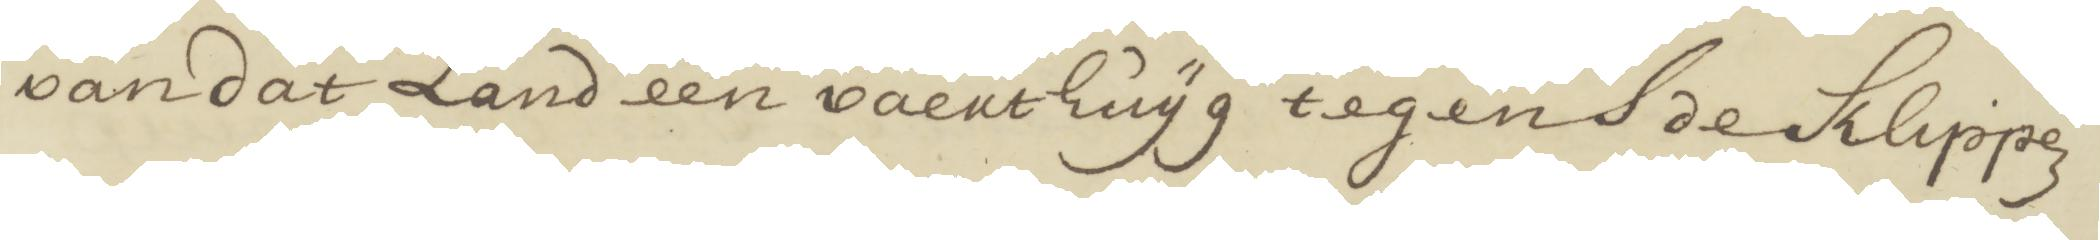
van dat Land een vaerthuijg tegens de klippen
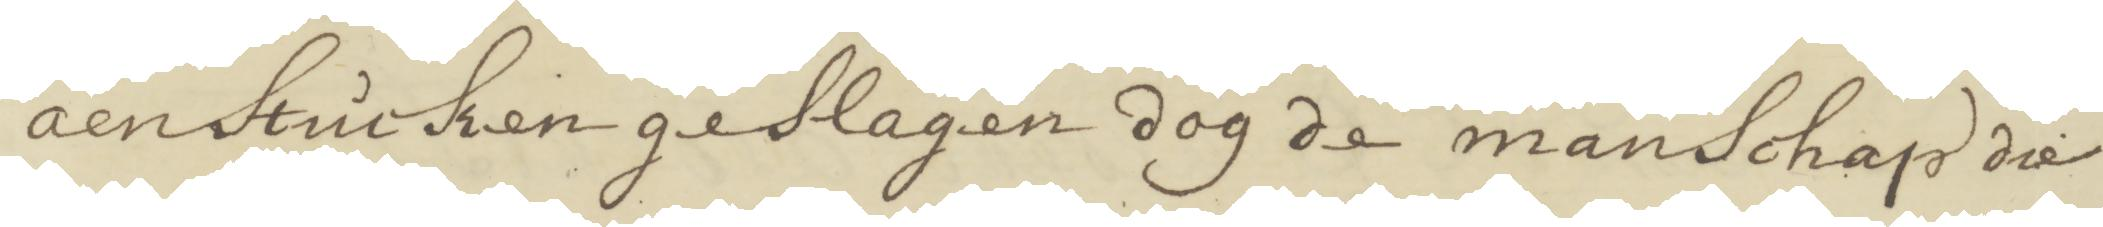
aen stucken geslagen dog de manschap die
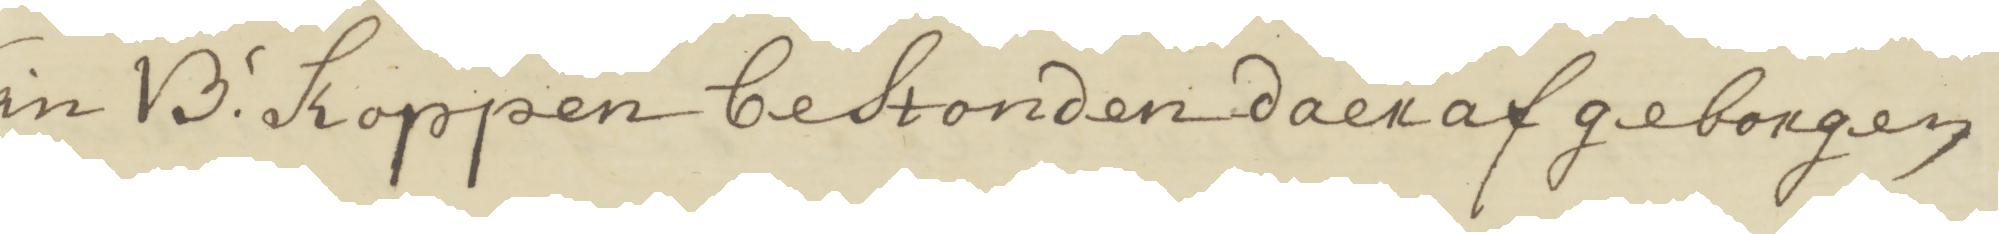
in 13.' koppen bestonden daer af geborgen
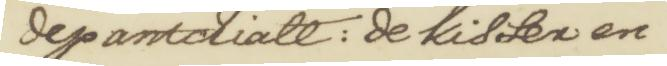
de pantchiall: de kisser en
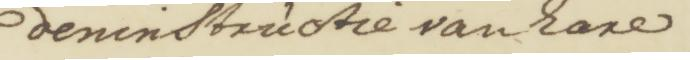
den instructie van hare
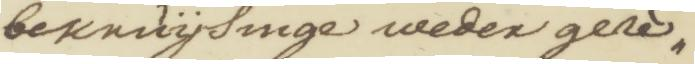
bekruijsinge weder gere„
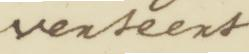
verteert
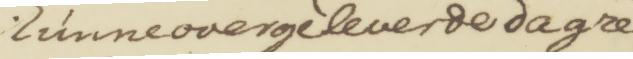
hunne overgeleverde dagre
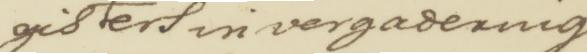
gisters in vergadering
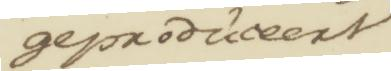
geproduceert
